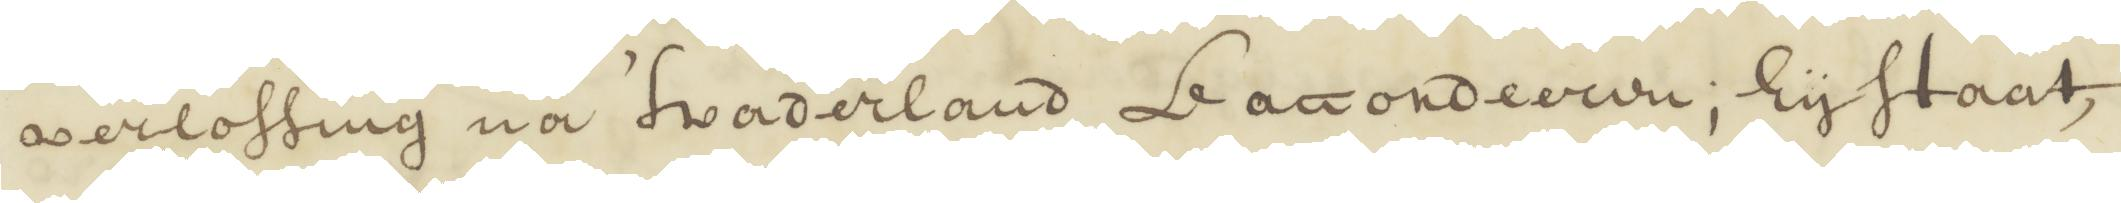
verlossing na 'tvaderland te accordeeren; hij staat,
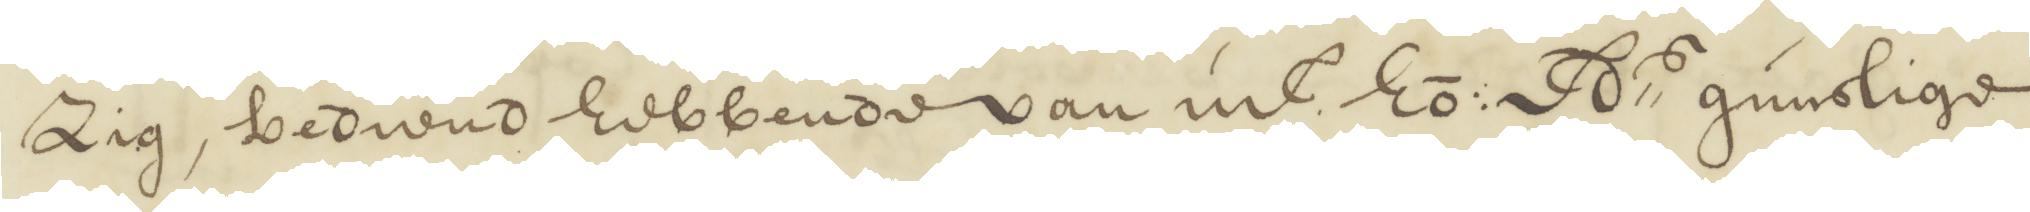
Zig, bediend hebbende van uE: ho: Ed„s gunstige
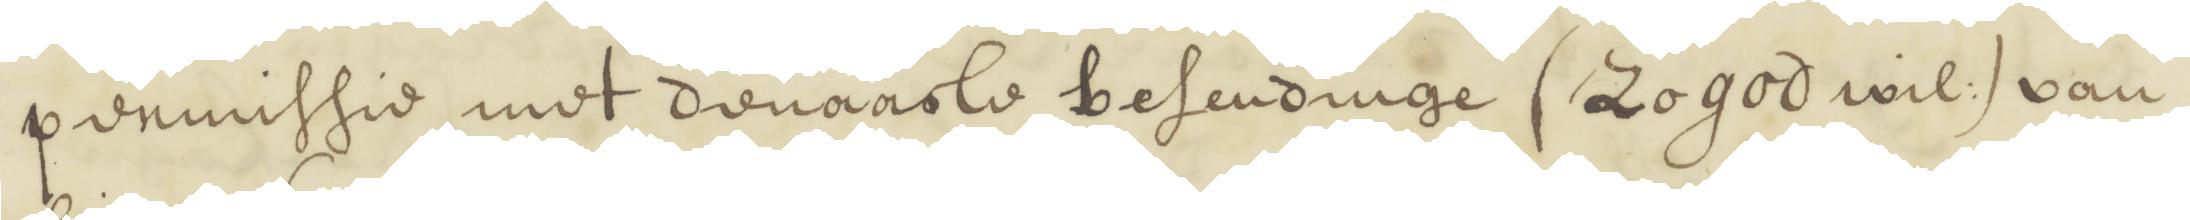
permissie met denaaste besendinge (Zo god wil:) van
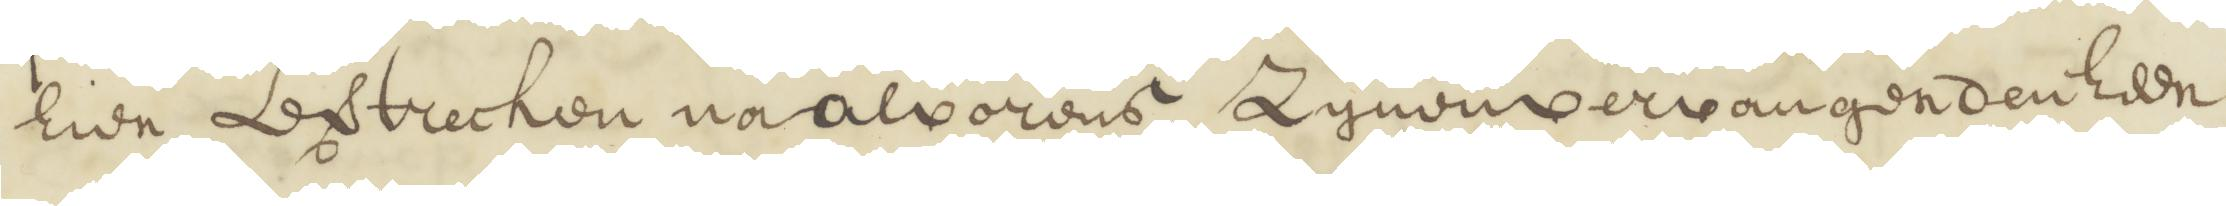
hier te vertrecken na alvorens Zynenvervanger den heer
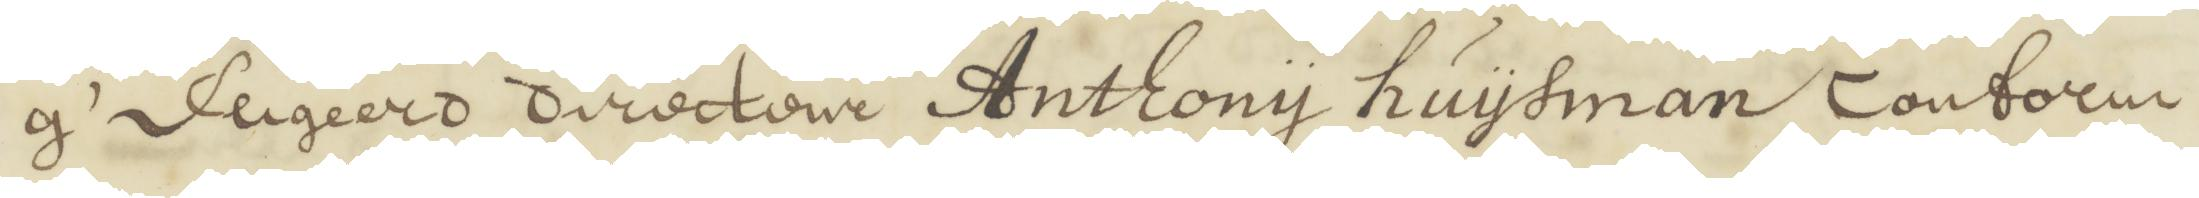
g’Eligeerd directeur Anthonij huijsman Conform
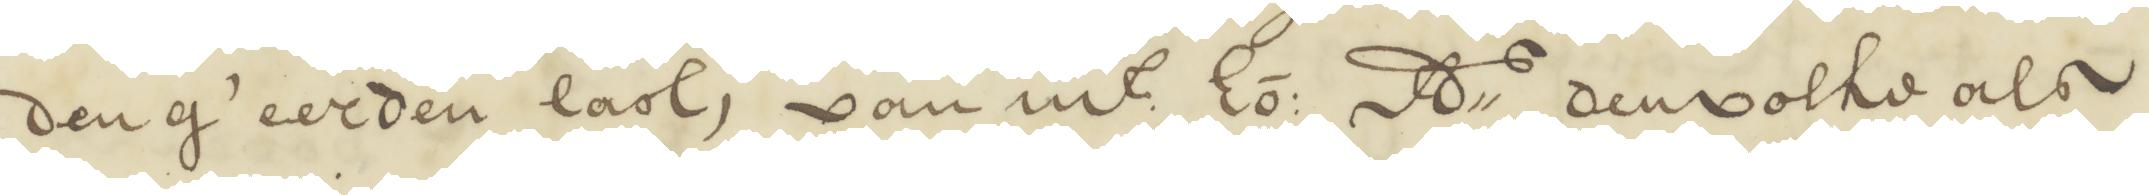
den g’ eerden last, van uE: ho: Ed„s denvolke als
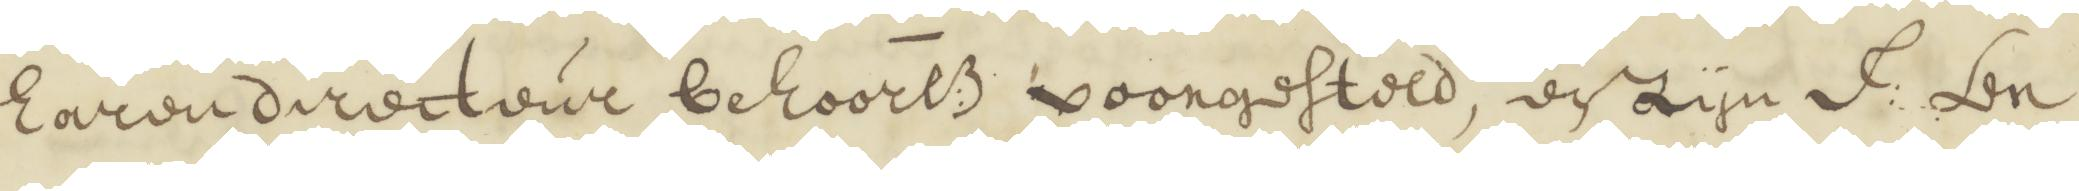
haren directeur behoorlijk voorgesteld, en zijn E: ten
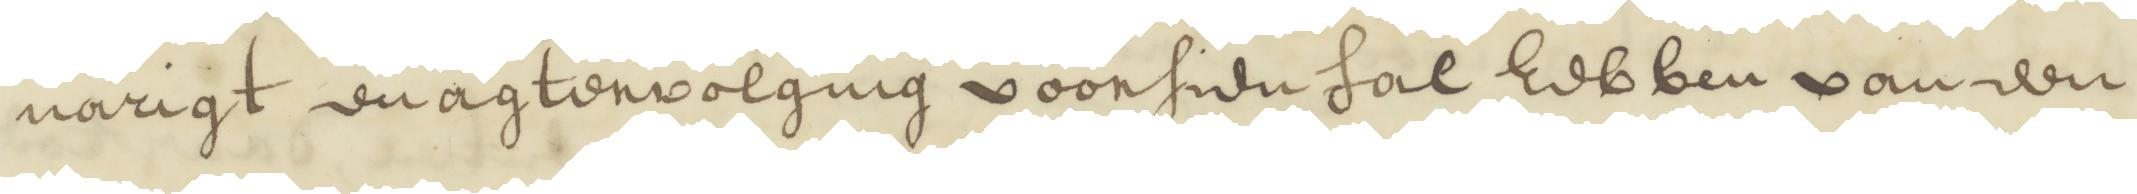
narigt en agtervolging voorsien sal hebben van een
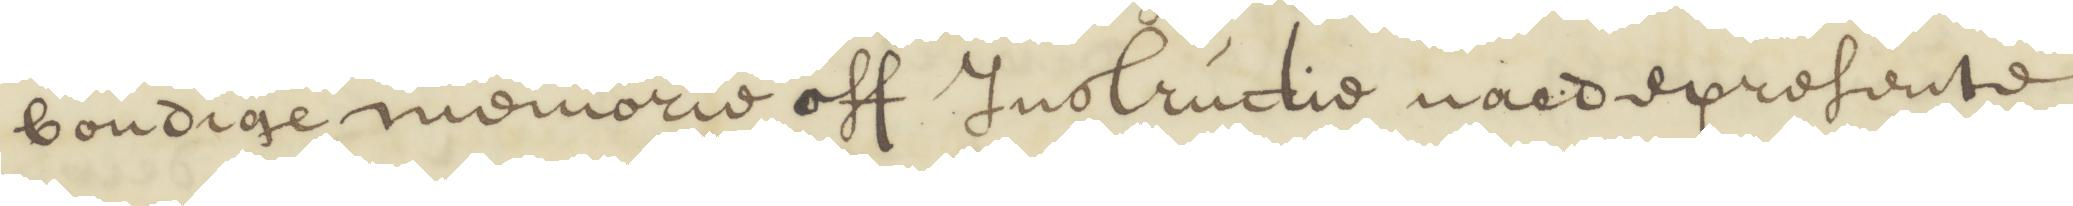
bondige memorie off Instructie nae de presente
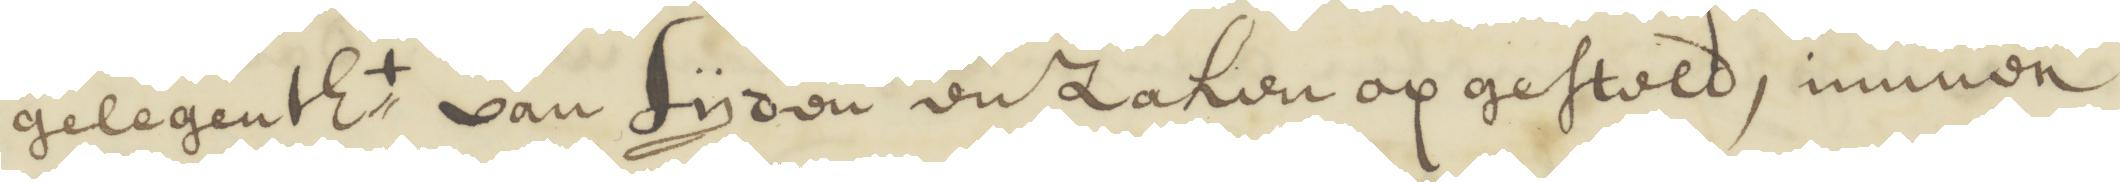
gelegenth„t van tijden en Zaken op gesteld, immer
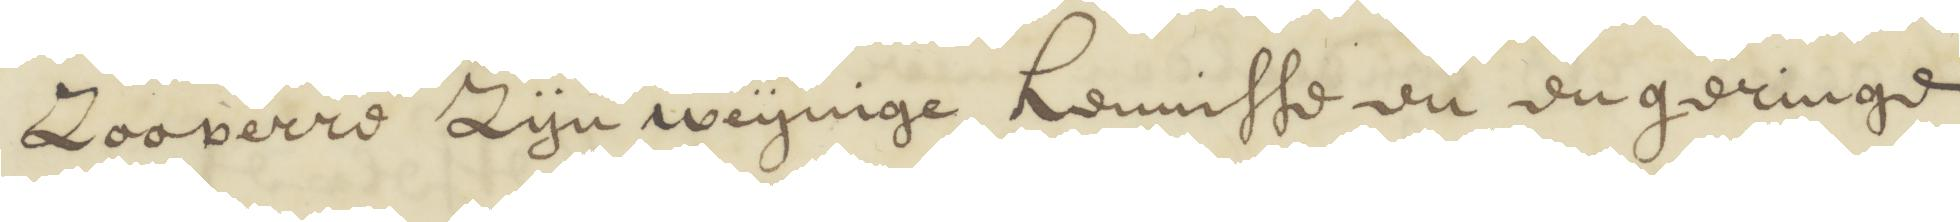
Zooverre Zijn weijnige kennisse en en geringe
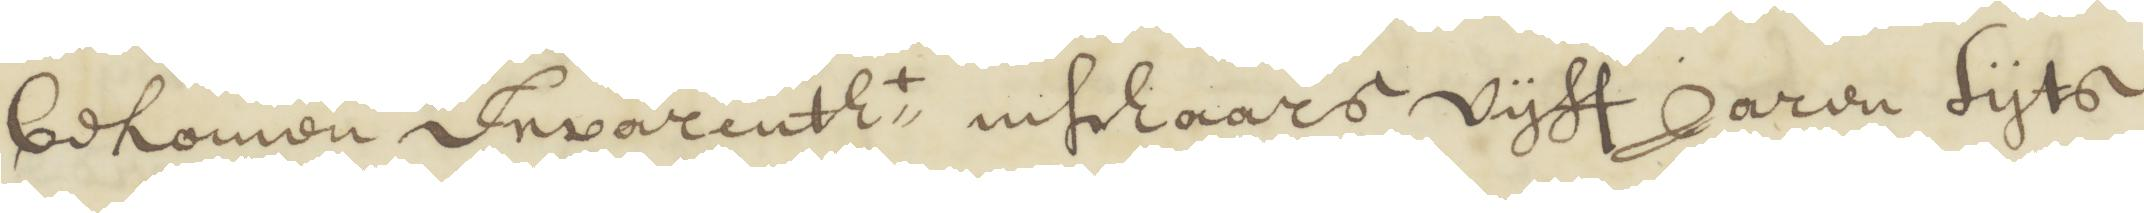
bekomen Ervarenth„t inschaars vijff Jaren tijts
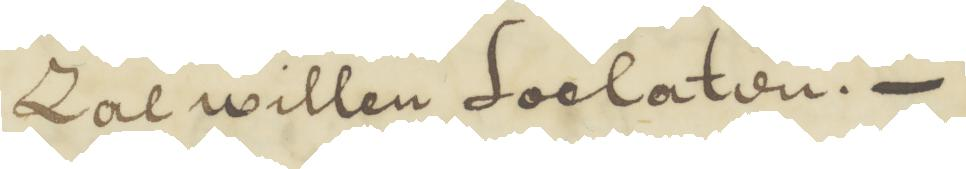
Zal willen toelaten. -
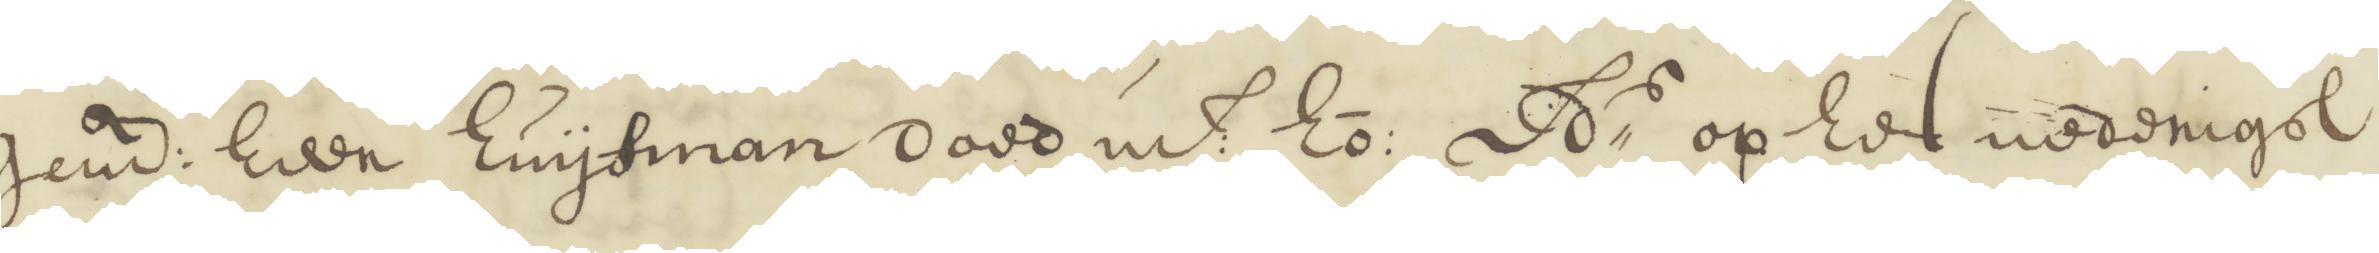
gem: heer huijsman doed uE: ho: Ed„s op het nederigst
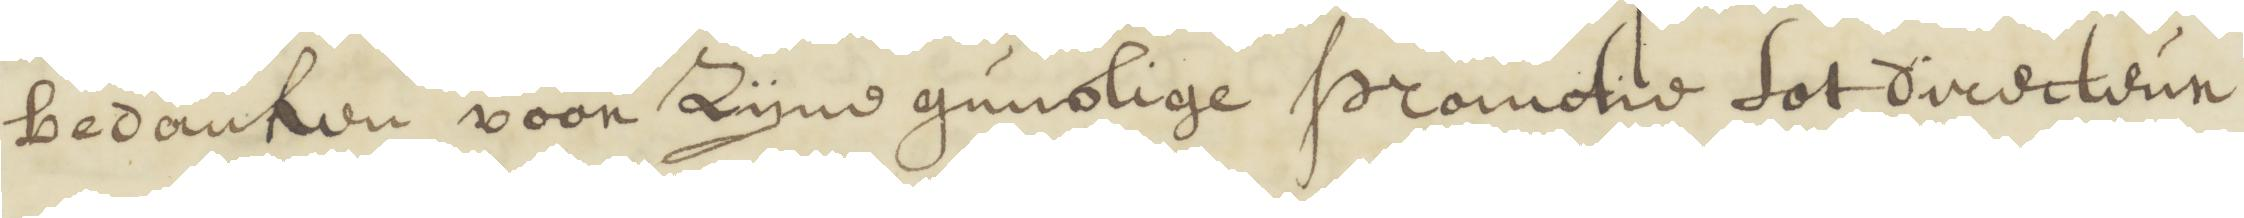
bedanken voor Zijne gunstige promotie tot directeur
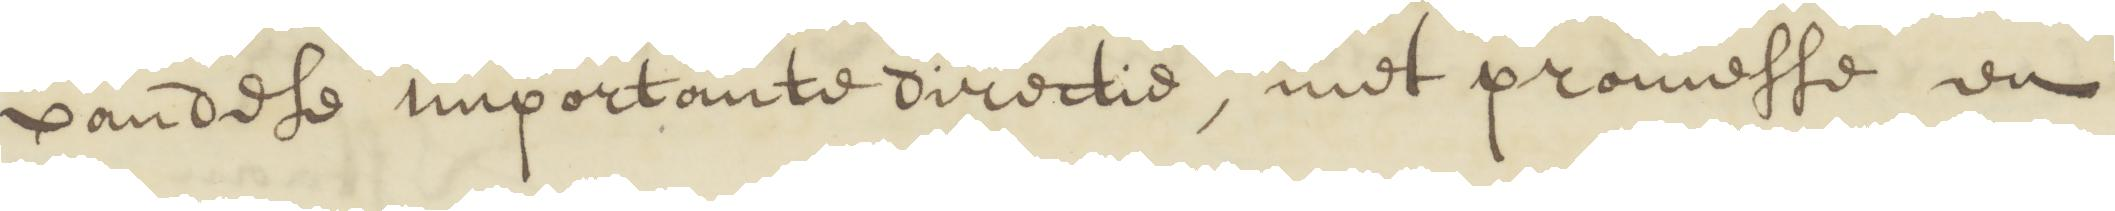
van dese importante directie, met promesse en
